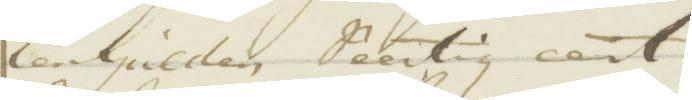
Een Gulden Veertig cent
